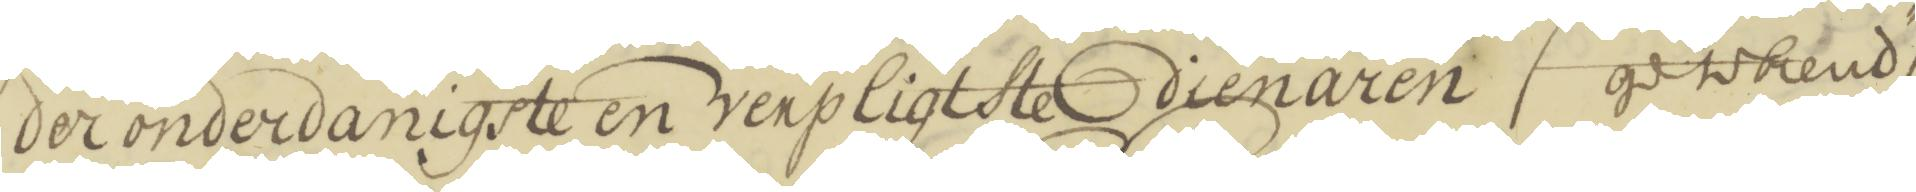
der onderdanigste en verpligtste dienaren ( getekend /
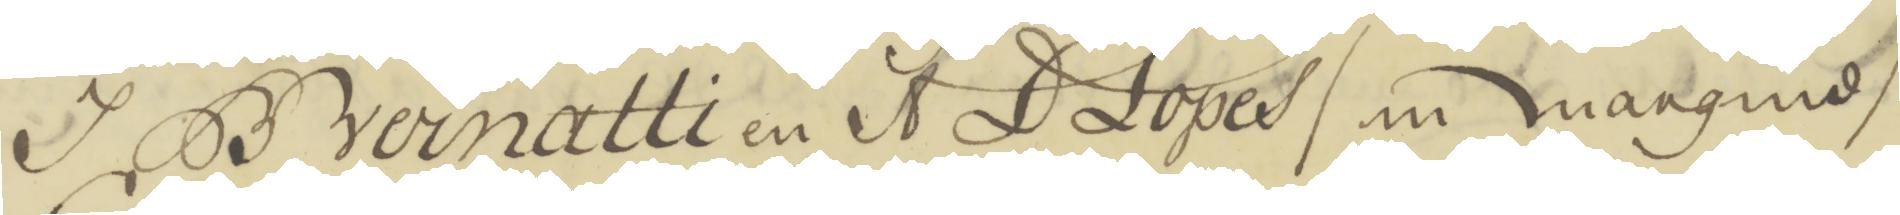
I B vernatti en A D Lopes / in margine/
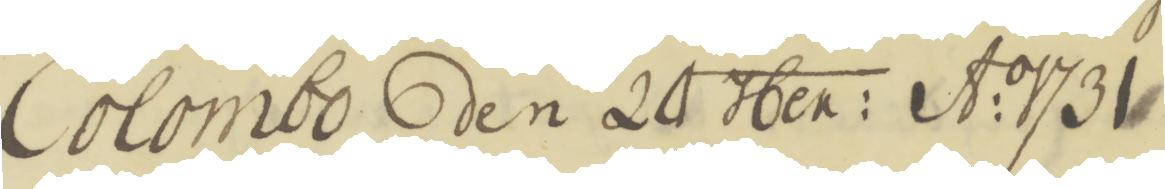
Colombo den 24 7ber: A:o 1731
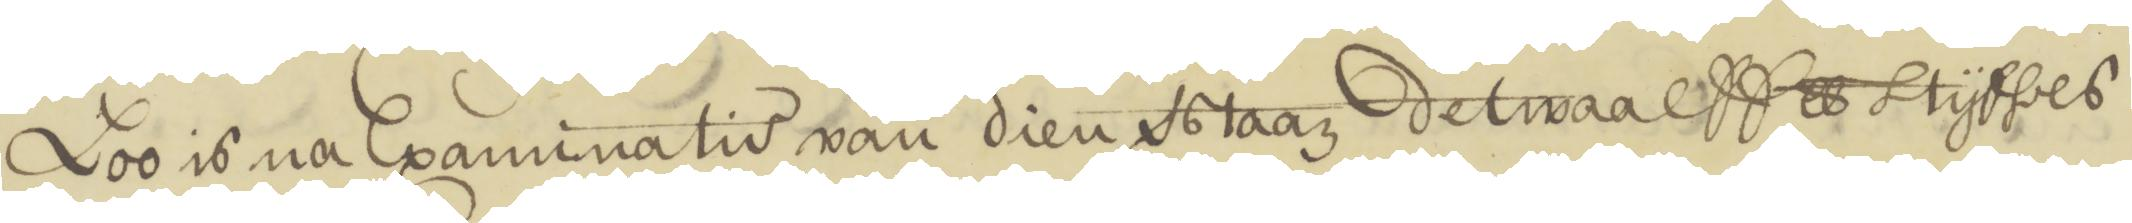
Zoo is na Examinatie van dien verstaan de twaalff lb stijffels
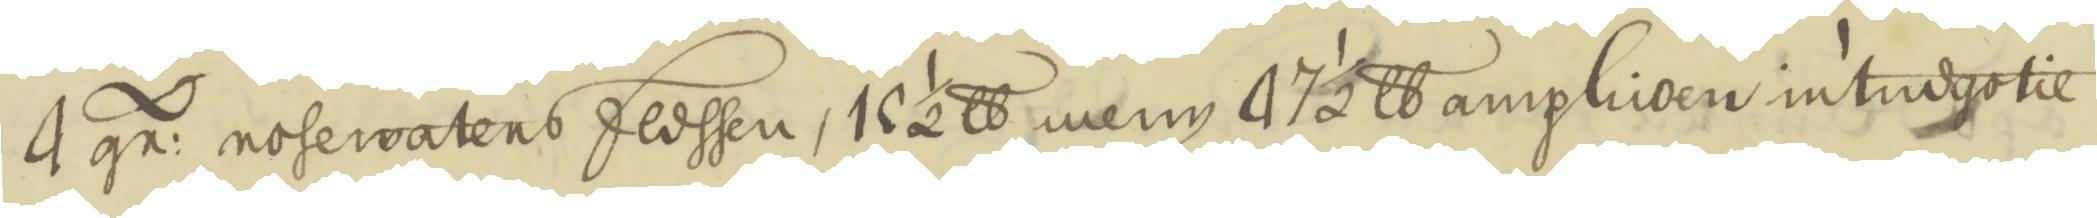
4 gr: rosewaters flessen, 15½ lb: meny 47½ lb amphioen in ’t negotie
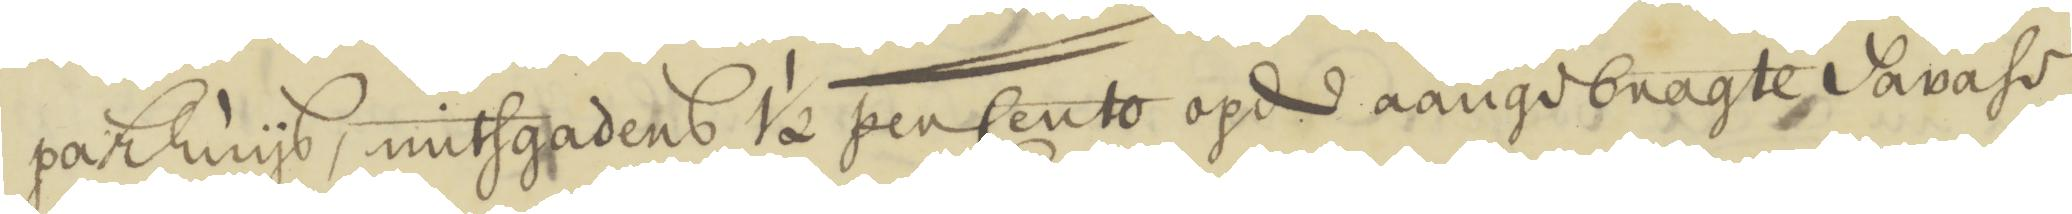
pakhuijs, mitsgaders 1½ percento opde aangebragte Iavase
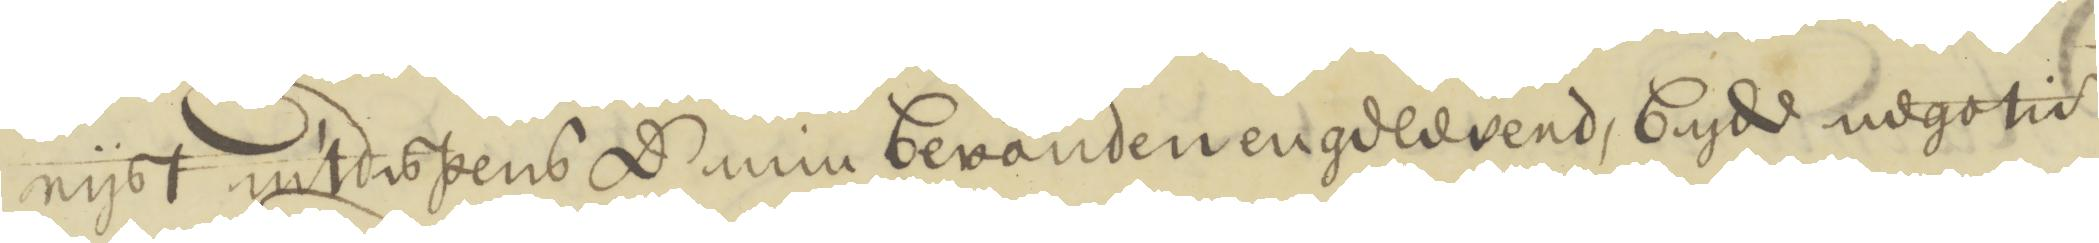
rijst in't dispens te min bevonden en geleverd, byde negotie
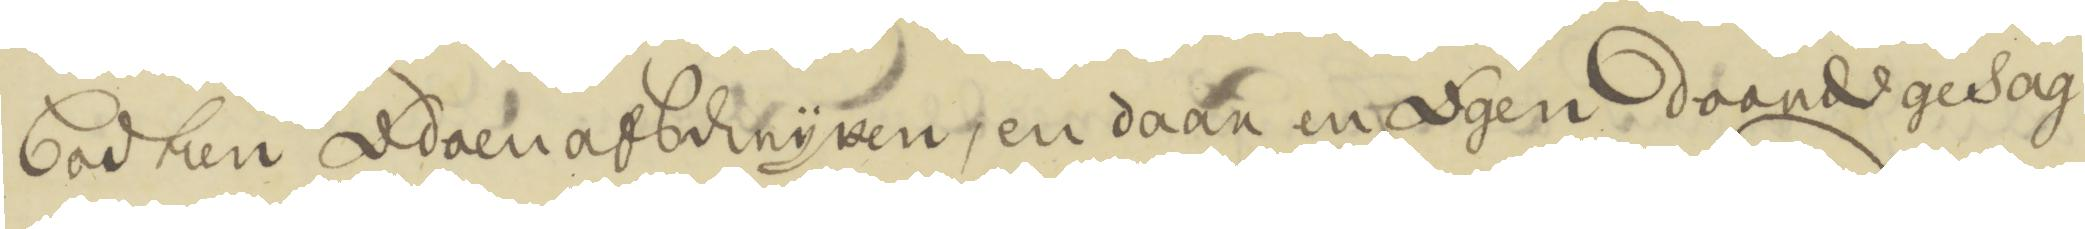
boeken te doen afschrijven, en daar en tegen door de gesag
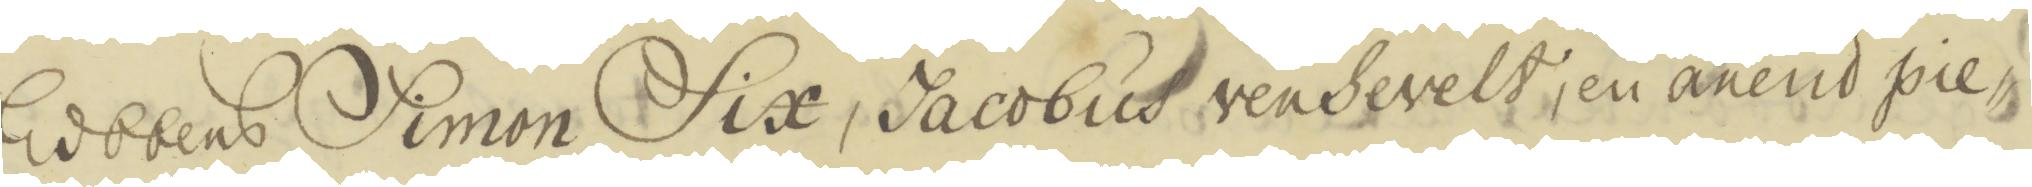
hebbers Simon Six, Iacobus versevelt, en arend pie„
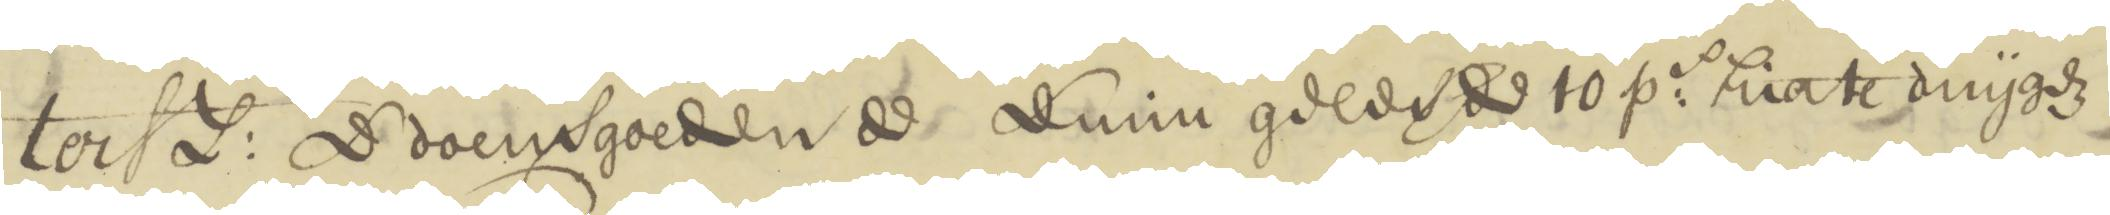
tersz: te doen vergoeden de temin geleverde 10 p:s kiate duijgen
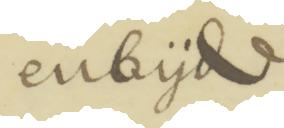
en bijde
